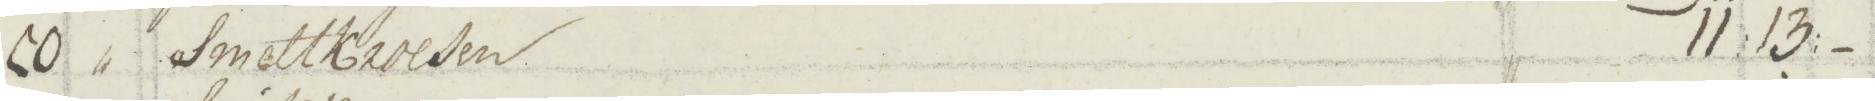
50 „ smeltkroesen „ 11:13:—
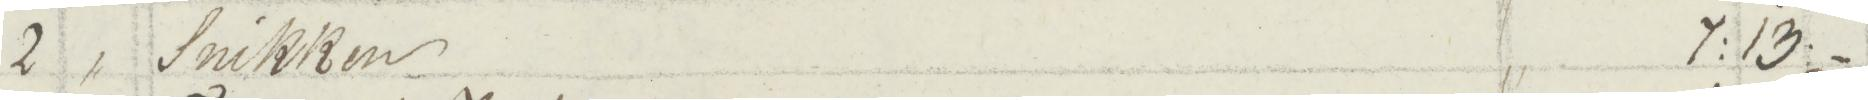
2 „ snikken „ 7:13:—
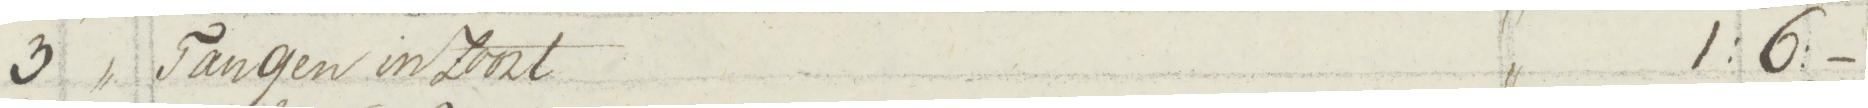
3 „ Tangen in zoort „ 1:6:—
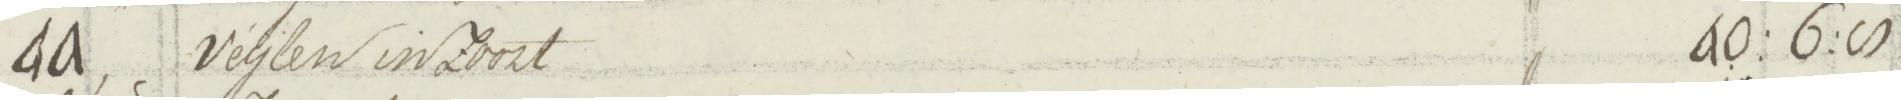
44 veijlen in zoort „ 40:6:8
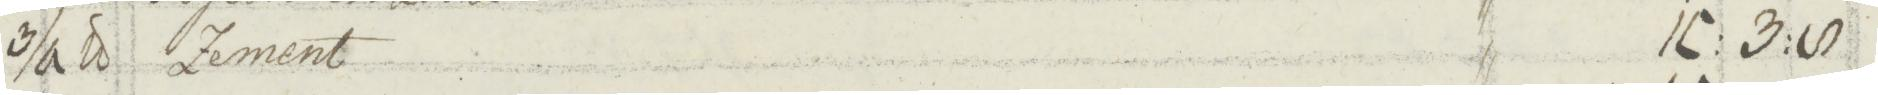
¾lb zement „ 15:3:8:
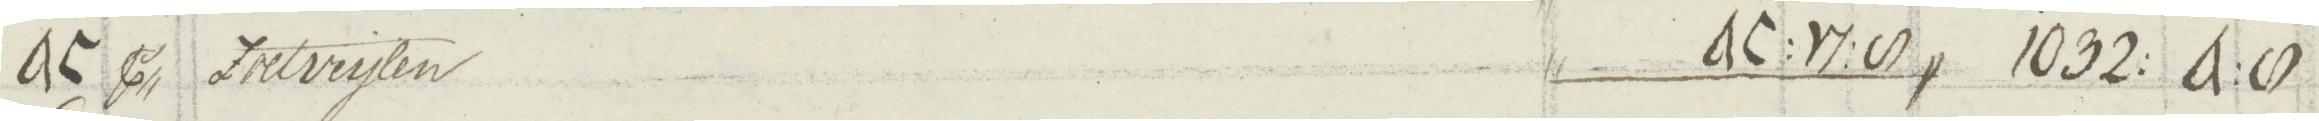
45 p„s zoetveijlen „ 45:17:8„ 1032: 4: 8
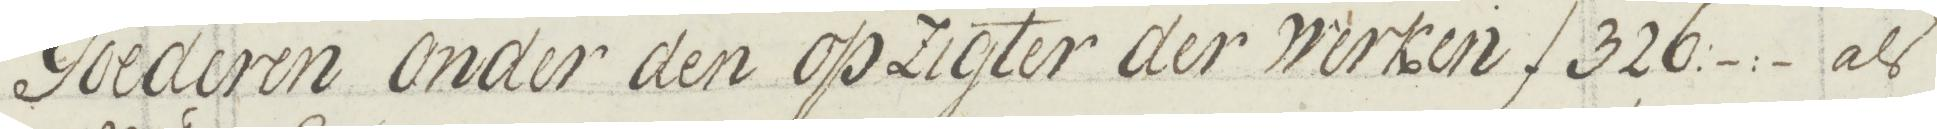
Goederen onder den opzigter der werken ƒ 320:—:— als
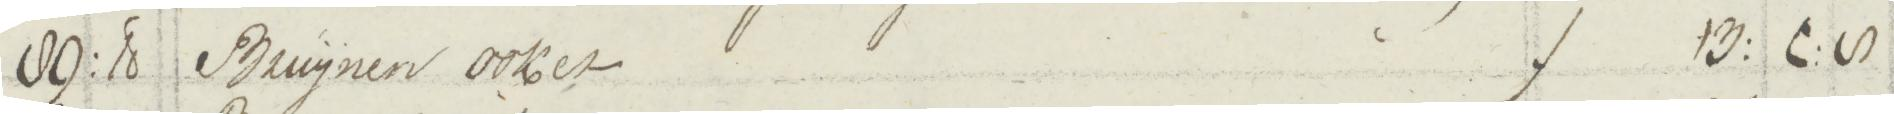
89:lb Bruijnen ooker ƒ 3:5:8
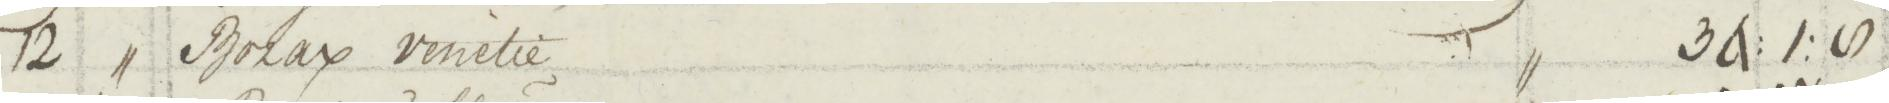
12 „ Borax venetie „ 34:1:8
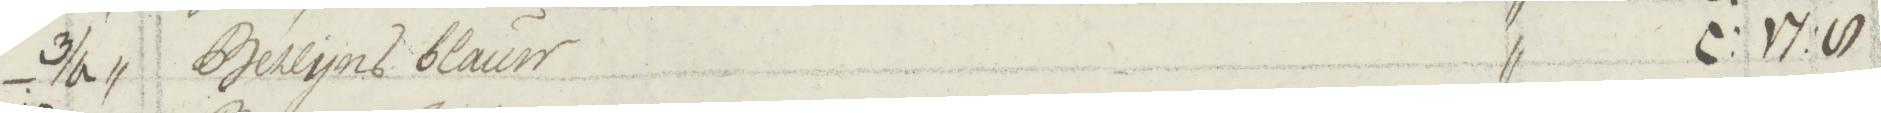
—¾„ Berlijns blauw „ 5:17:8
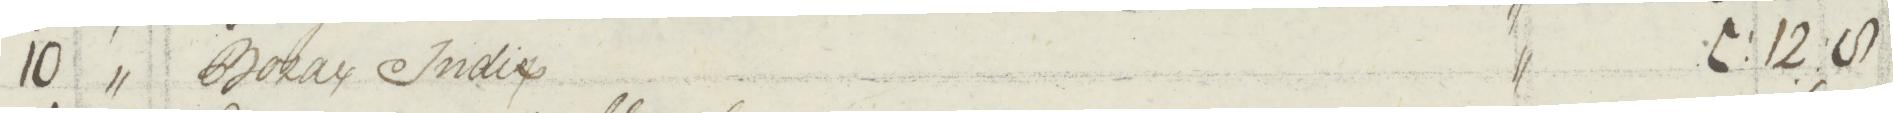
10 „ Borax Indix „ 5:12:8
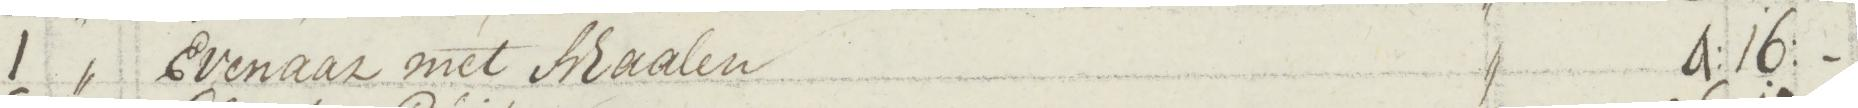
1 „ Evenaar met schaalen „ 4:16: -
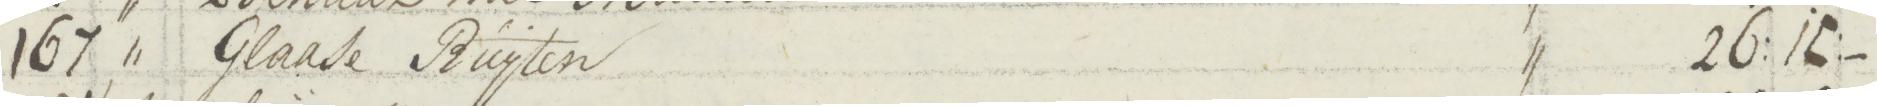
167 „ Glaase Ruijten „ 26:15:—
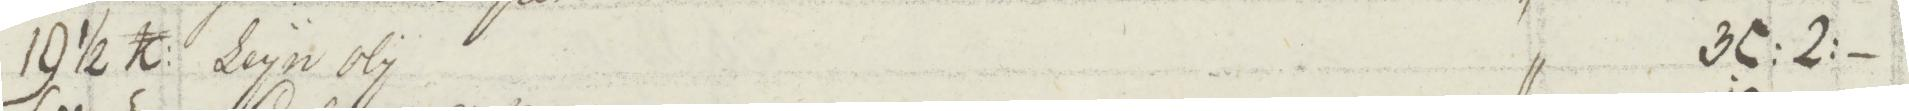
19½ lb: Leijn olij „ 35:2:—
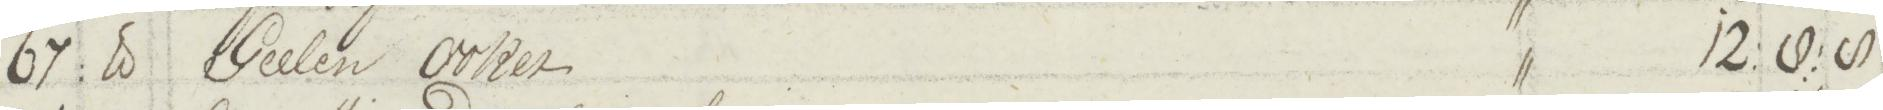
67: lb Geelen Ooker „ 12:8:8
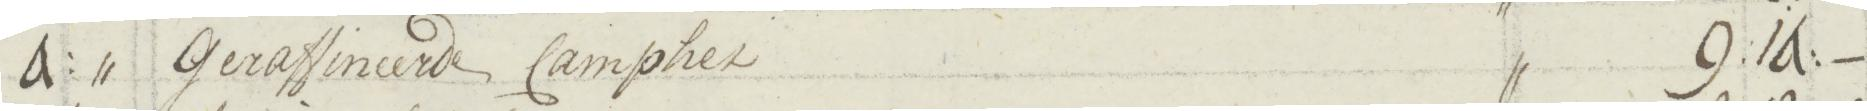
4: „ Geraffineerde Campher „ 9:14:—
